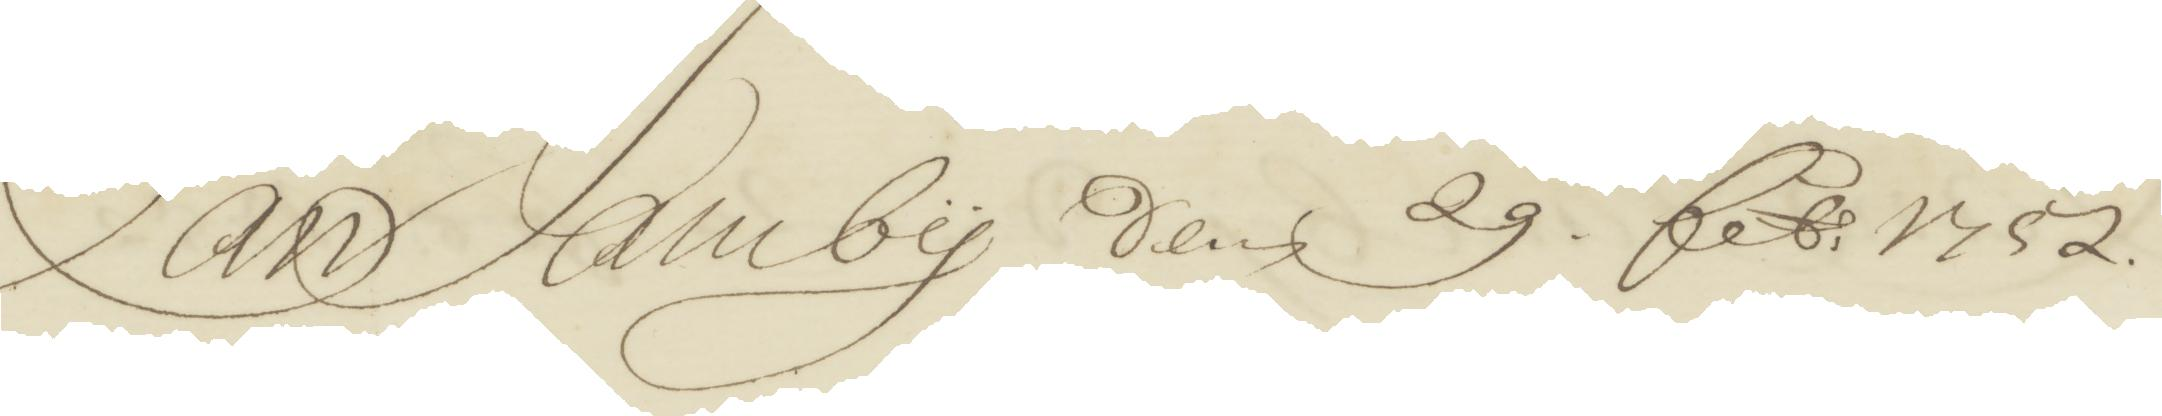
Van Jambij den 29.' feb: 1752.
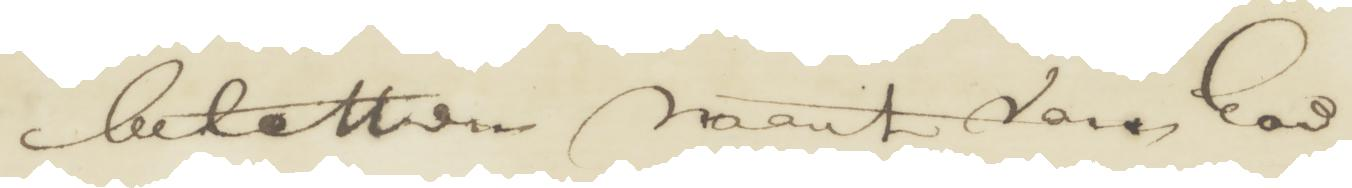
beletten want van hoe
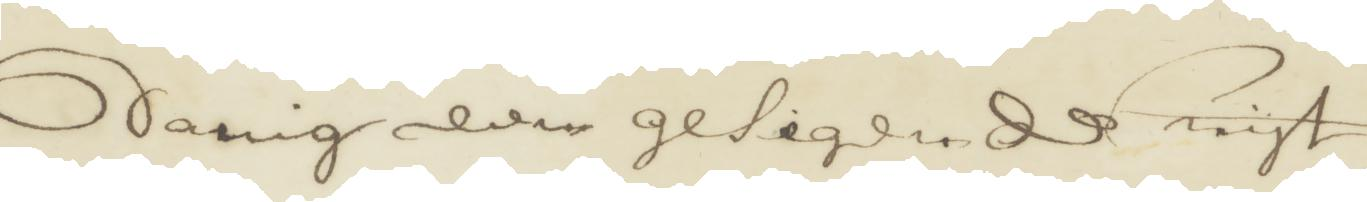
danig een gesigend uijt
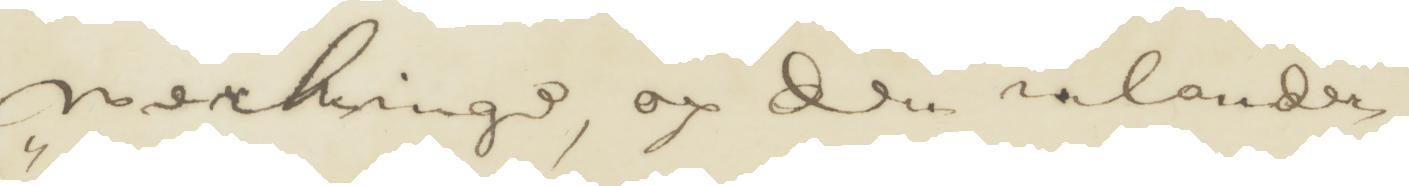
„werkinge, op den inlander,
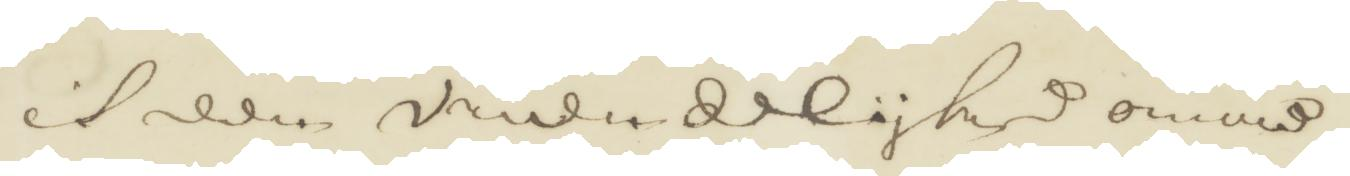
es een vriendelijke omme
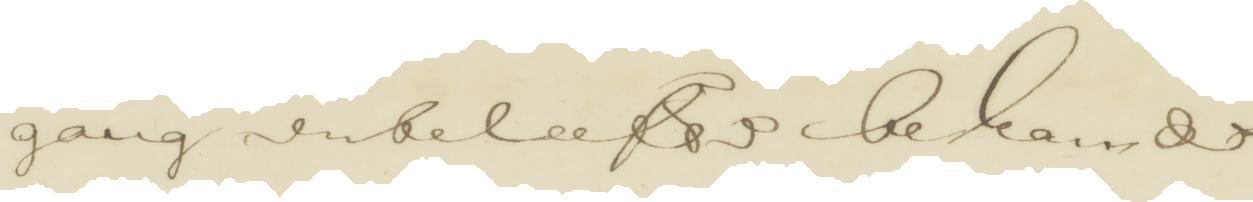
gang en beleefde behande
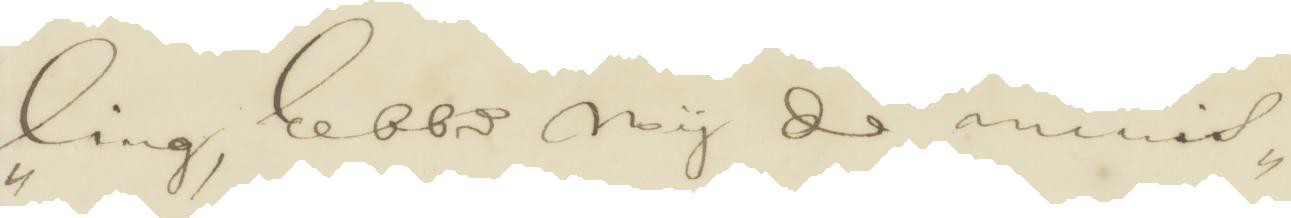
„ling, hebbe wij de minis„
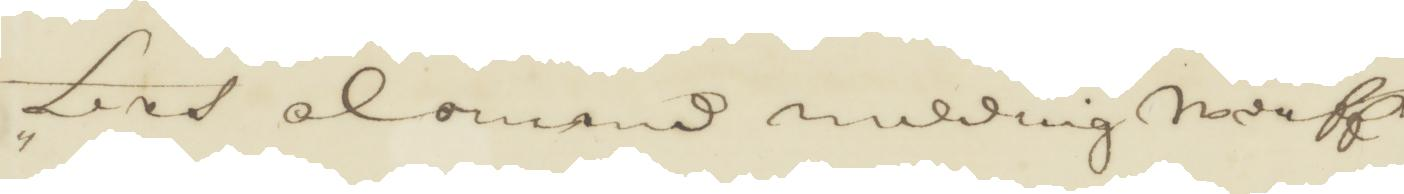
„ters alomme meenig werff
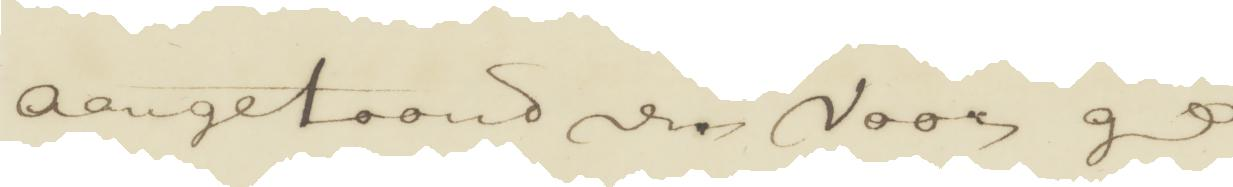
aangetoond en voor ge
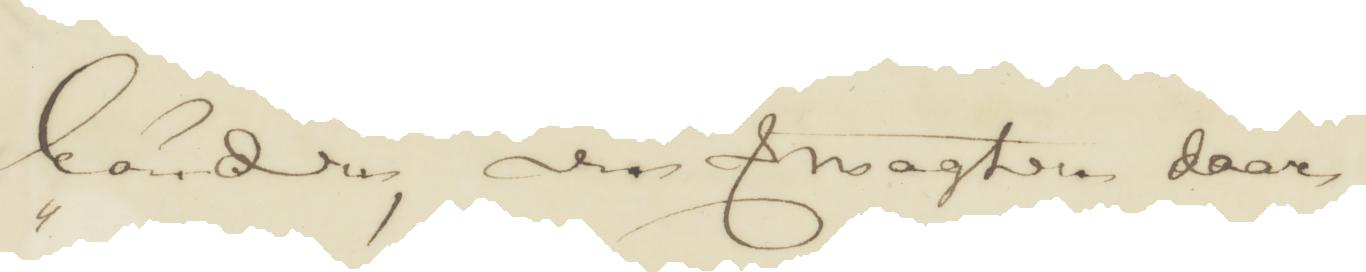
„houden, en verwagten daar
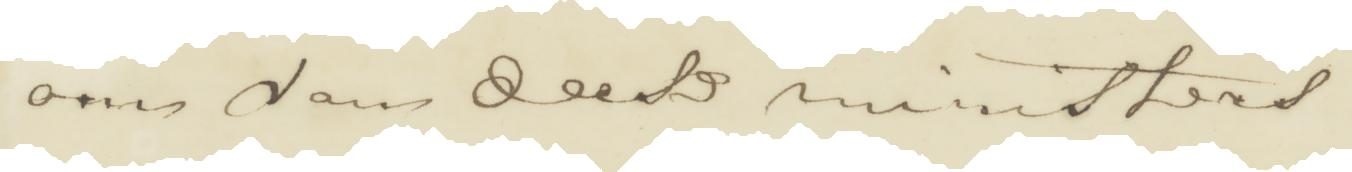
om van deese ministers
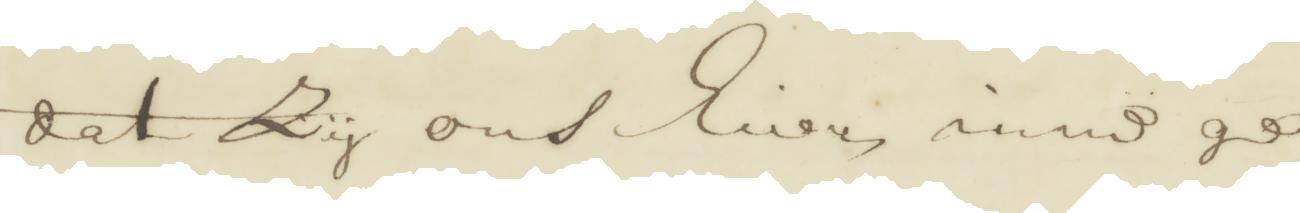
dat zij ons hier inne ge
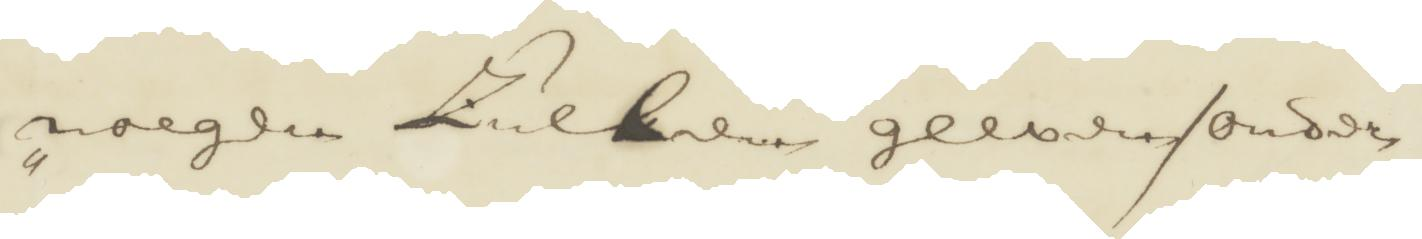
„noegen zullen geevens / onder
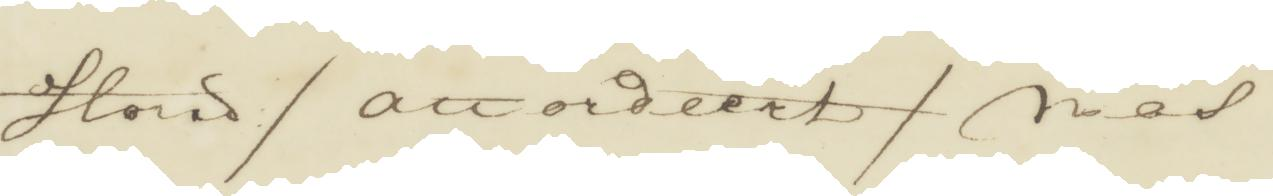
stond /accordeert/ was
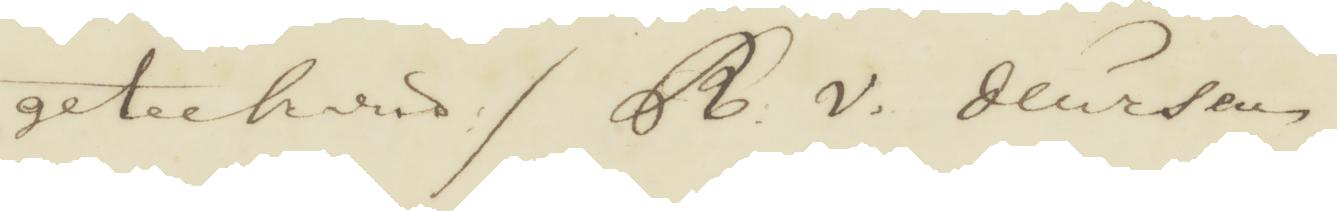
geteekend:/ R: v. deursen
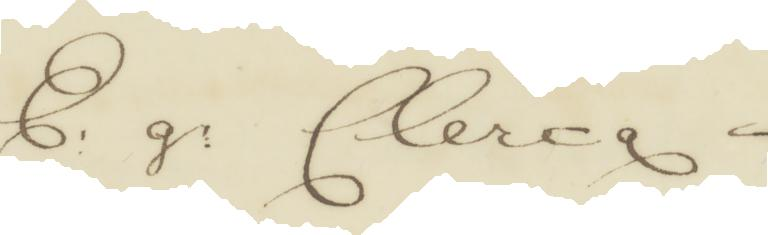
E: g: Clercq-.
